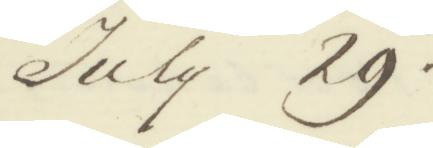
July 29
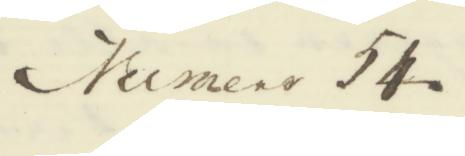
Numero 54.
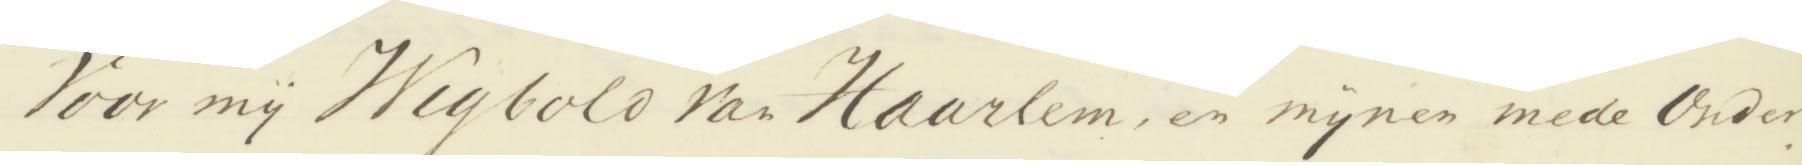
Voor mij Wigbold van Haarlem, en mijnen mede Onder
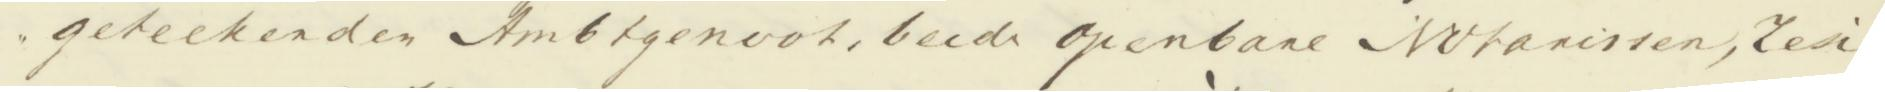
„geteekenden Ambtgenoot, beide openbare Notarissen, resi
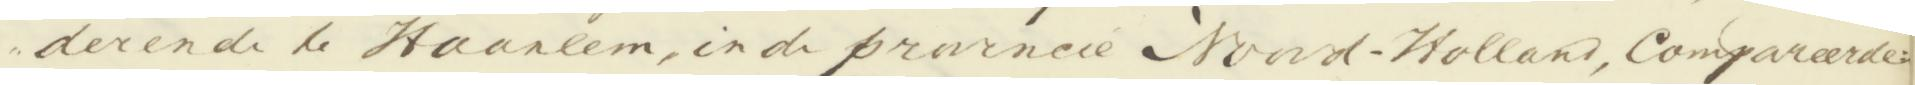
„derende te Haarlem, in de provincie Noord-Holland, Compareerde
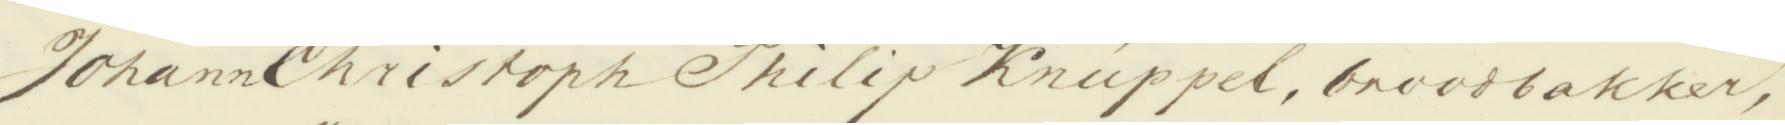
Johann Christoph Philip Knuppel, broodbakker,
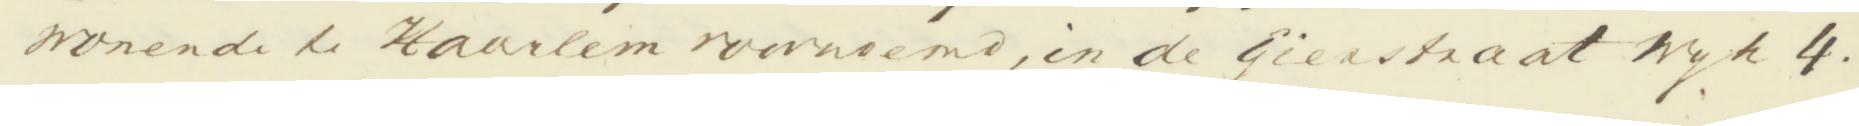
wonende te Haarlem voornoemd, in de Gierstraat wyk 4.
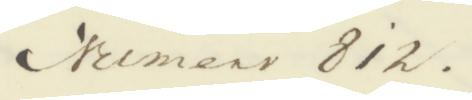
Numero 812.
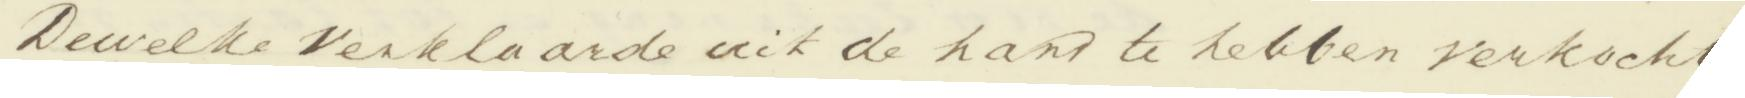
Dewelke verklaarde uit de hand te hebben verkocht
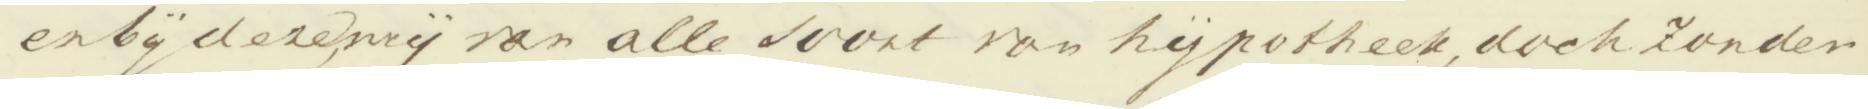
en bij deze vrij van alle soort van hijpotheek, doch zonder
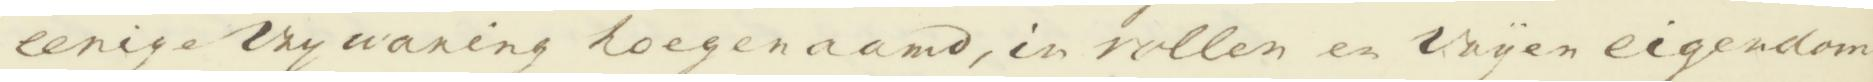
eenige vrywaring hoegenaamd, in vollen en vrijen eigendom
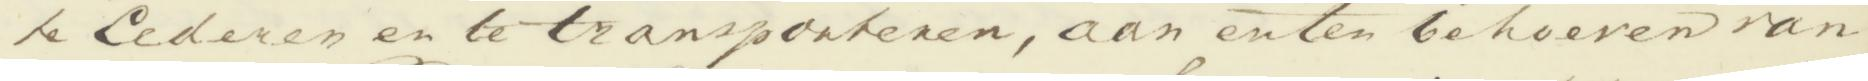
te Cederen en te transporteren, aan en ten behoeven van
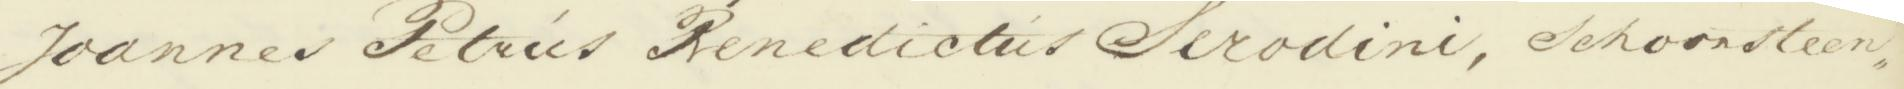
Joannes Petrus Genedictus Serodini, Schoorsteen„
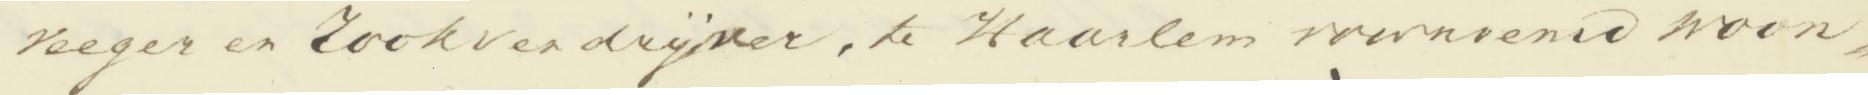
veeger en rookverdrijver, te Haarlem voornoemd woon
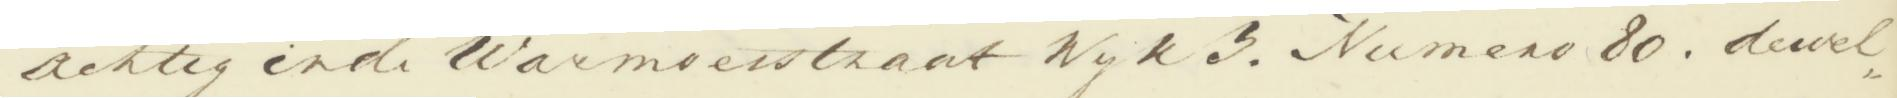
achtig inde Warmoesstraat Wyk 3. Numero 80, dewel„
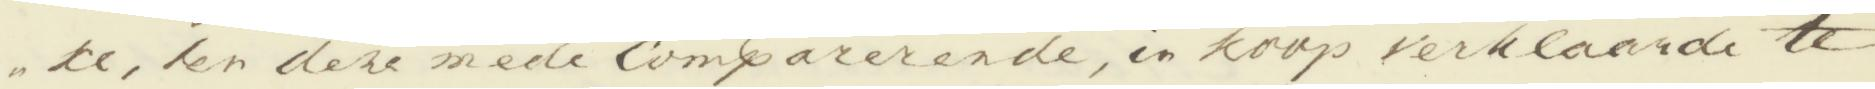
„ke, ter deze mede Comparerende, in koop verklaarde te
